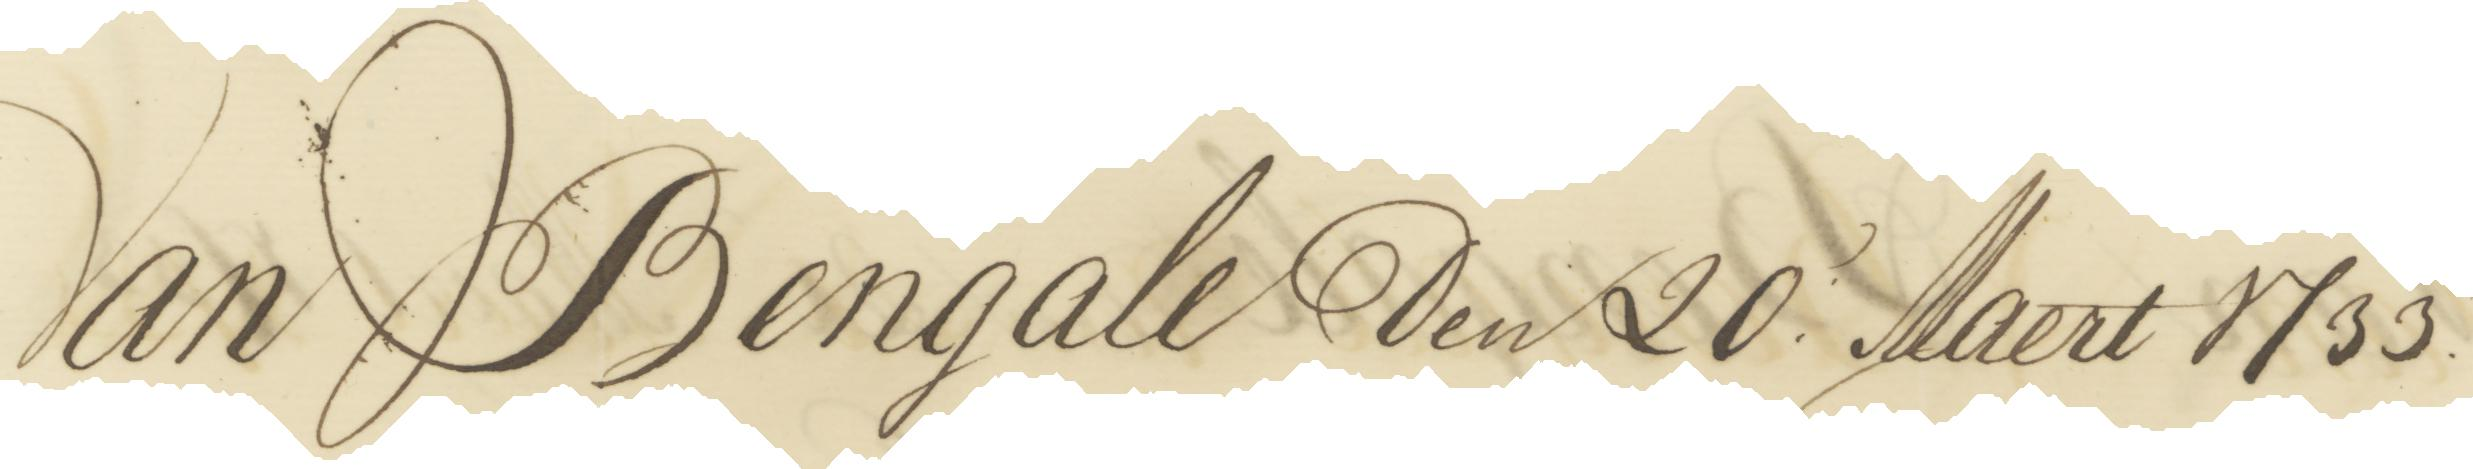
Van Bengale den 20:' Maert 1733.
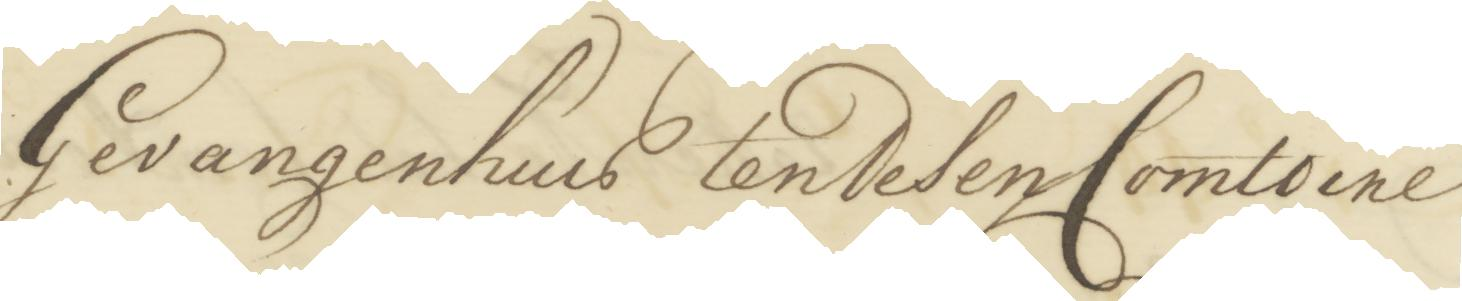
Gevangenhuis ten desen Comtoire
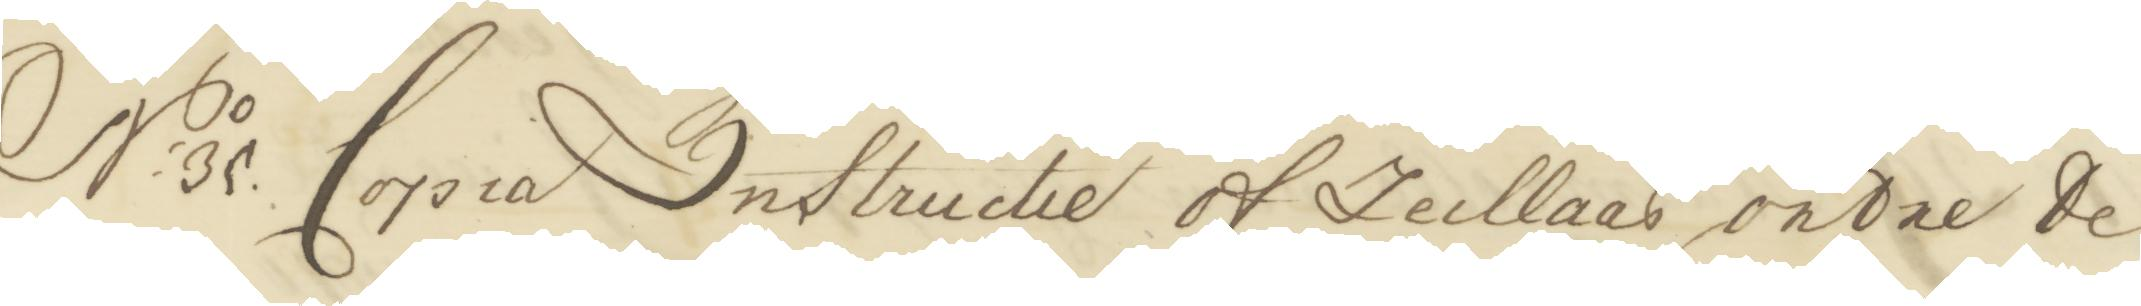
N:o 35. Copia Instructie of Zeillaas ordre de
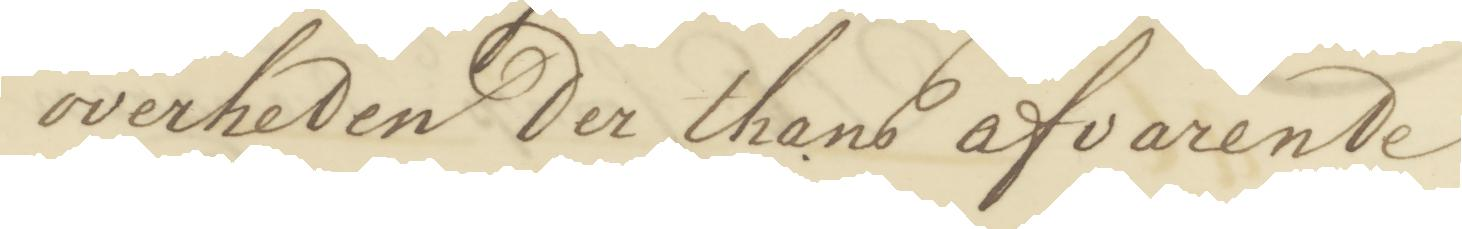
overheden der thans afvarende
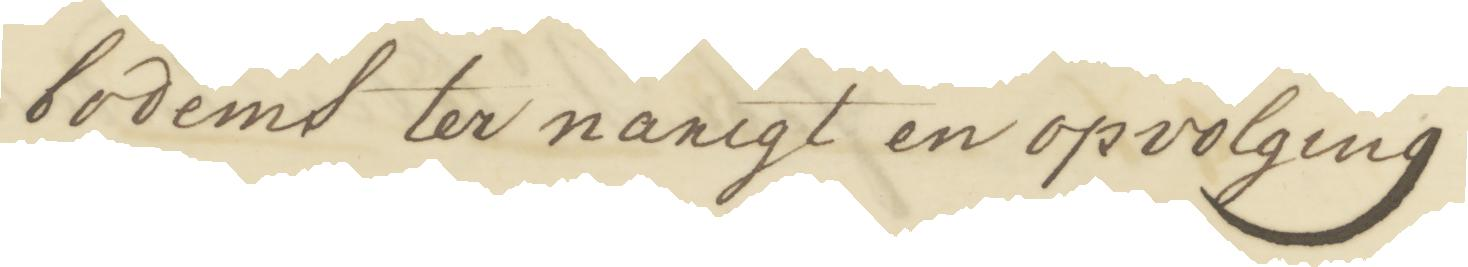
bodems ter narigt en opvolging
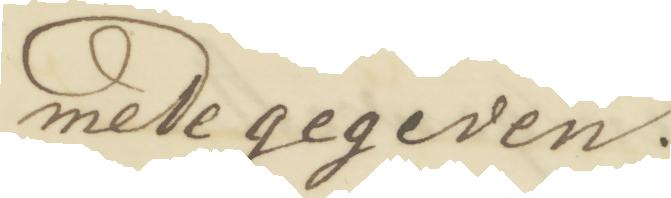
mede gegeven.
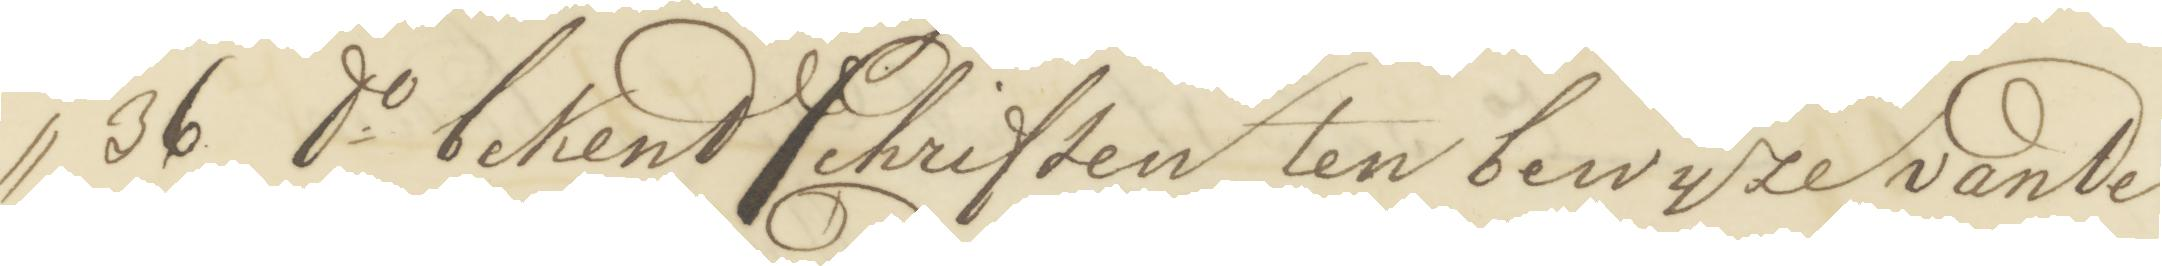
„ 36 d:o bekend Schriften ten bewijze van de
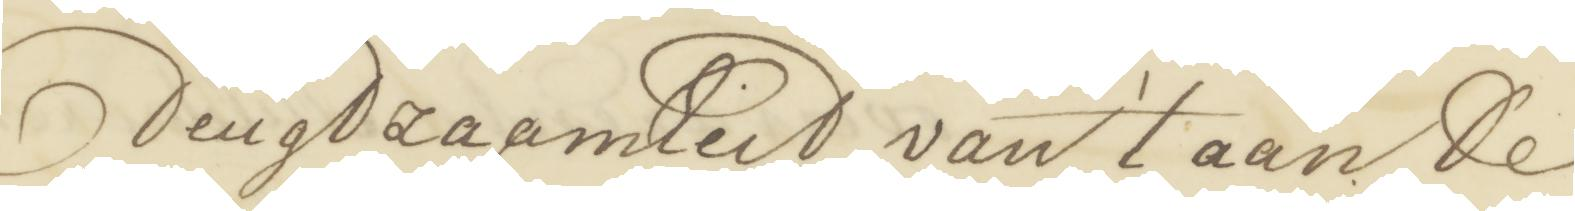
deugdzaamheid van ’t aan de
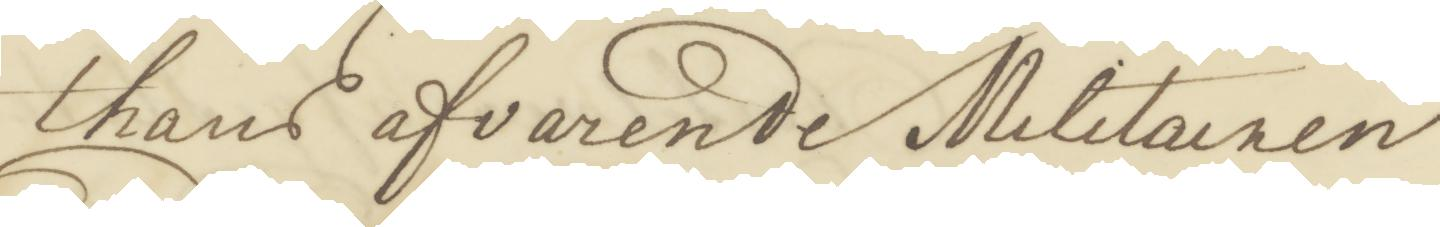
thans afvarende Militairen
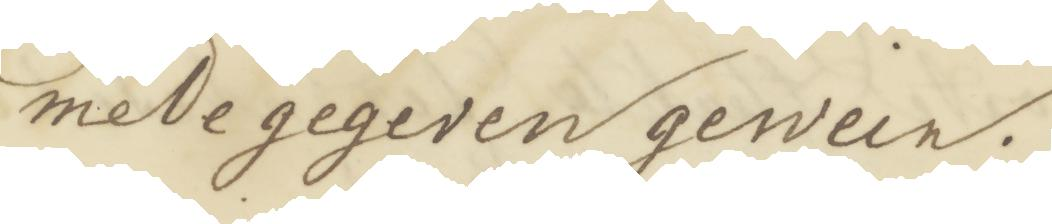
mede gegeven geweir.
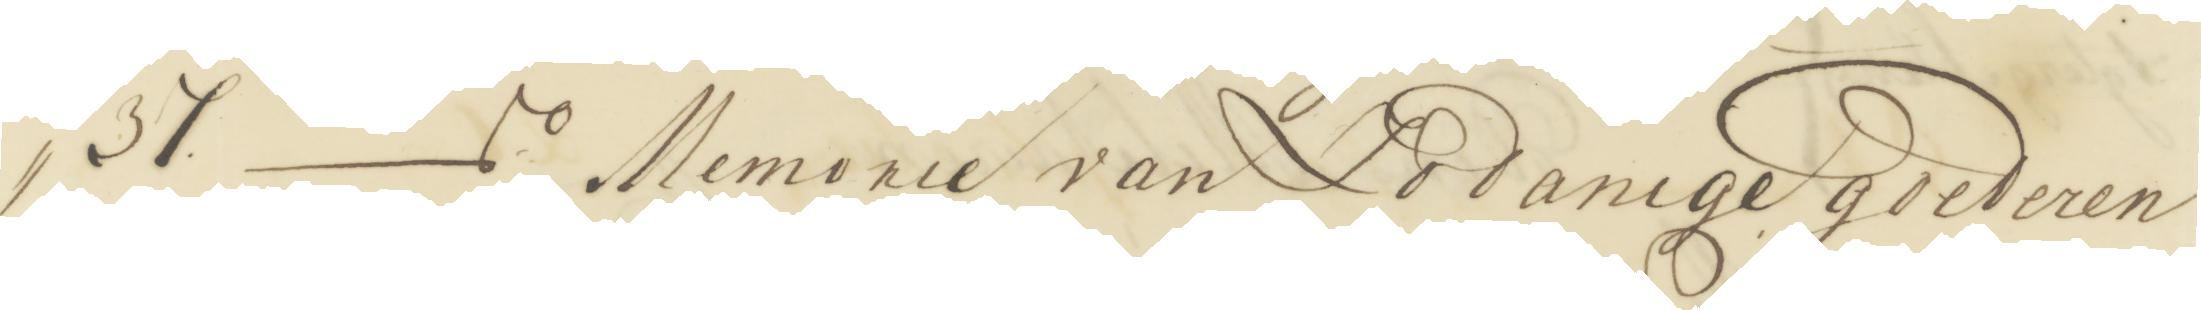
„37. —„o Memorie van Zodanige goederen
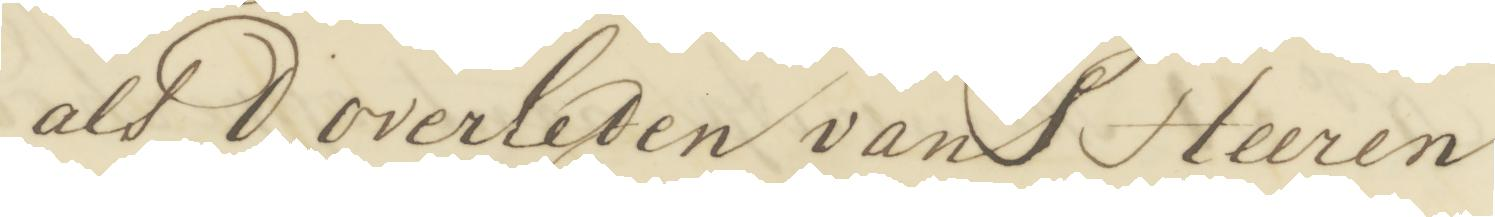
als D. overheden van 'S Heeren
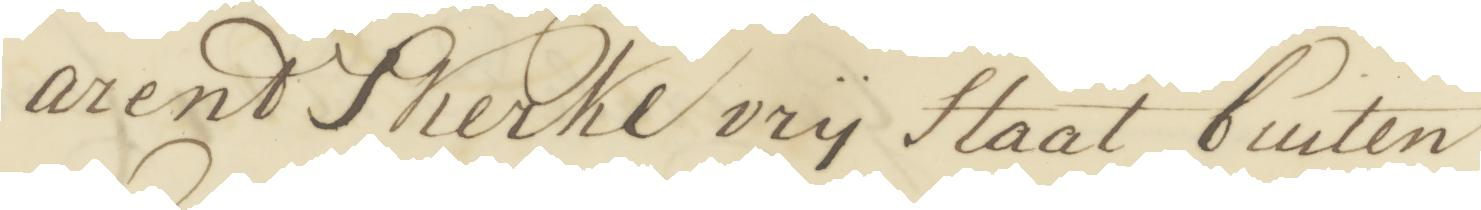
arendskerke vrij staat buiten
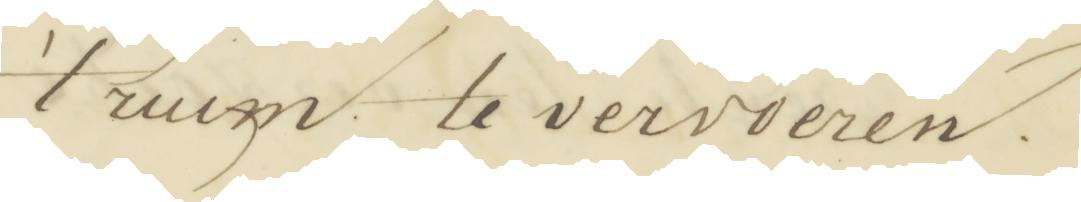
't ruim: te vervoeren.
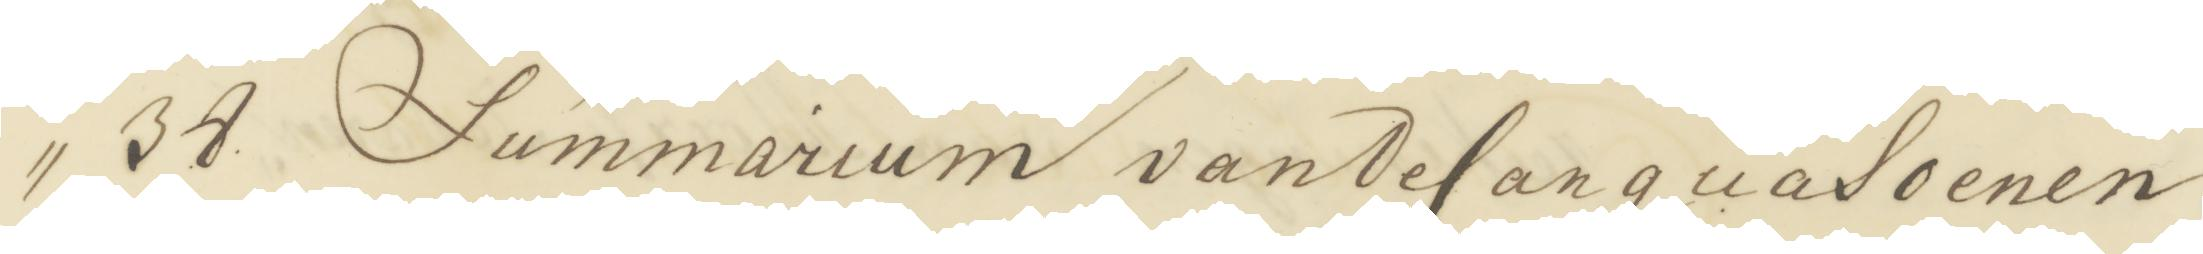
„ 38. Summarium van de Carguasoenen
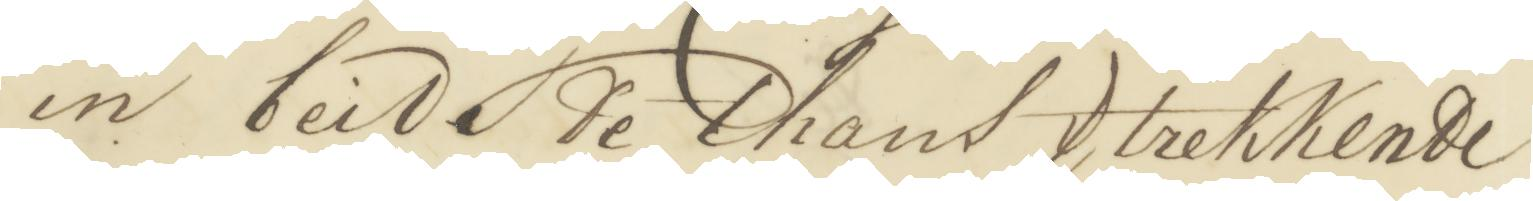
in beide de thans vertrekkende
